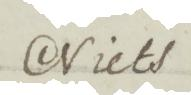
Niets
